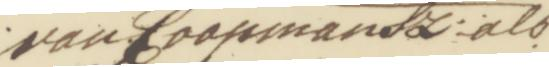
van Coopmansz: als
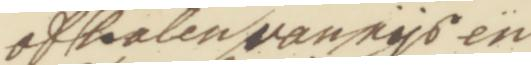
afhalen van rijs en
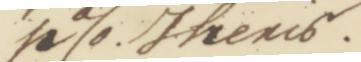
pa/o. Ikeris.
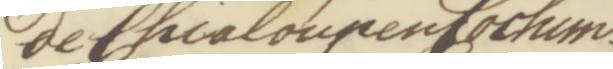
de Chialoupen Cochim
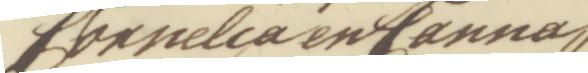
Cornelia en Canna„
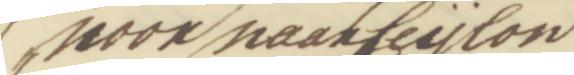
„noor naar Ceijlon
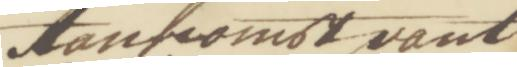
Aankomst van’t
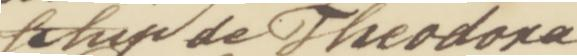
schip de Theodora
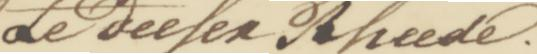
te deeser Rheede.
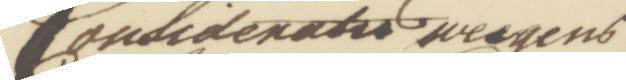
Consideratie weegens
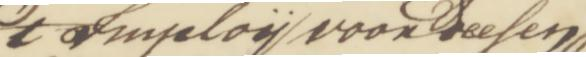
’t Emploij voor deesen,
